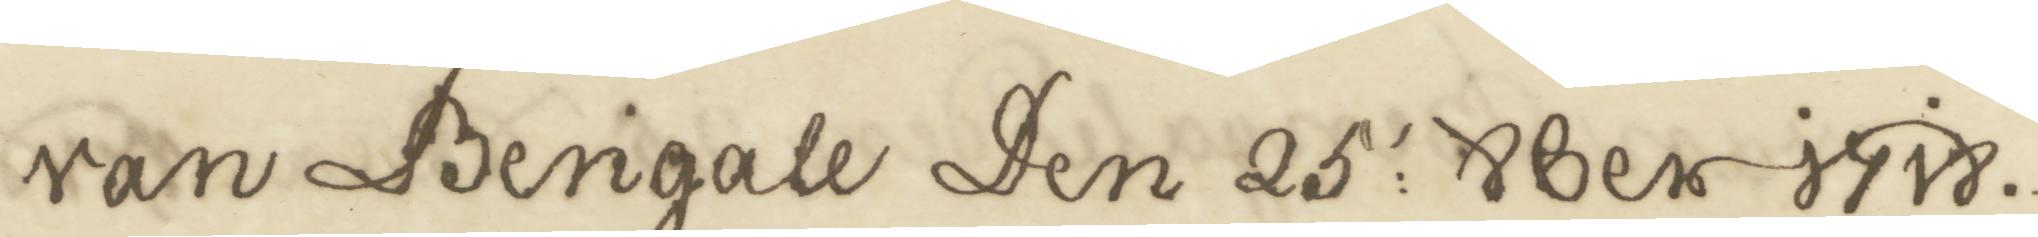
van Bengale Den 25:' 8ber 1718.
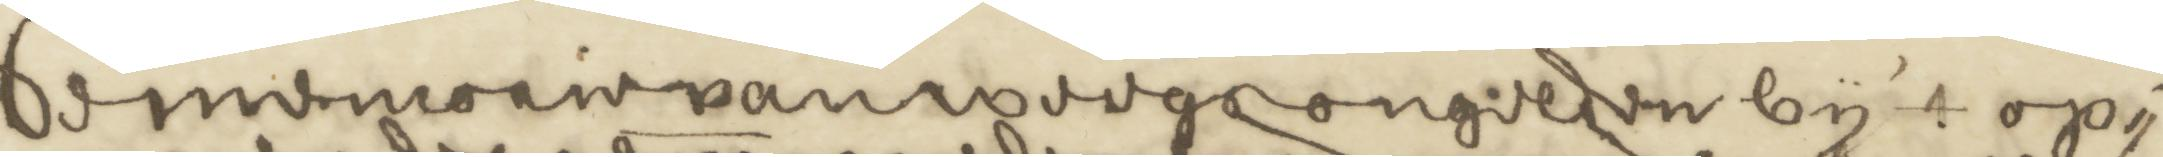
de memorie van weegs ongelden bij ’t op„
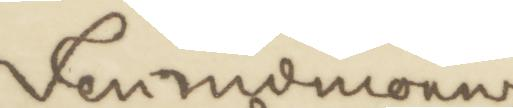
Een memorie
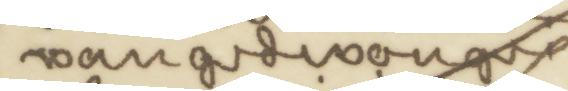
van gedwonge
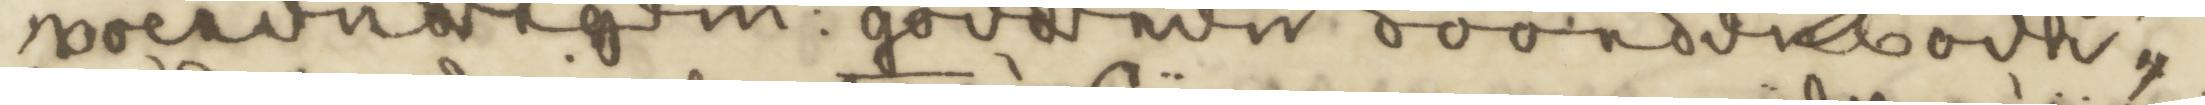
voeren der gem: goederen door den boek„
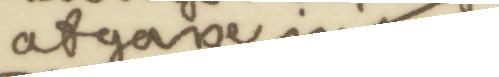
afgave in't op
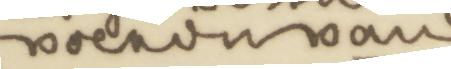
voeren van
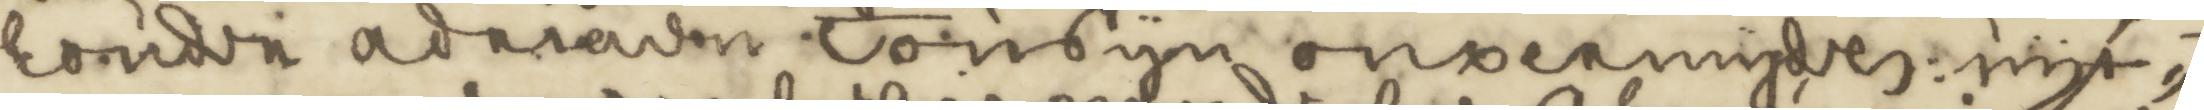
houder adriaen Cousijn onvermijdelijk uijt„
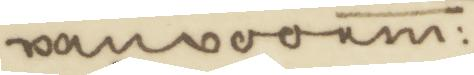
van voorm:
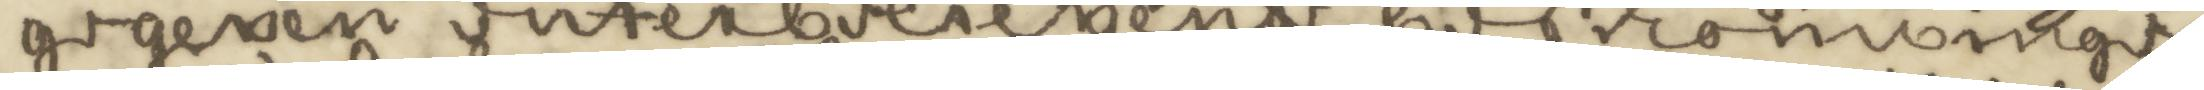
gegeven en ter believende beschouwinge
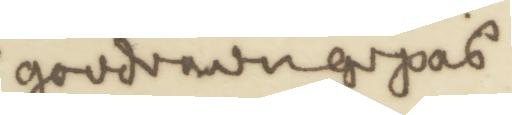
goederen gepas
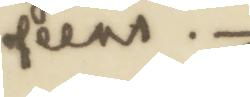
seert.
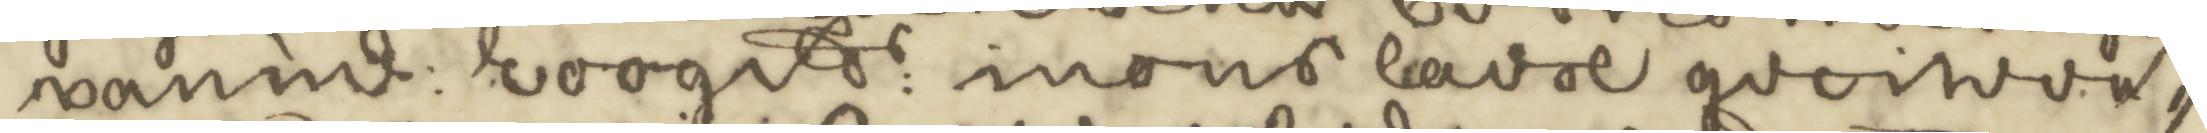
van uE: hoog Ed:s in ons laest geciteer„
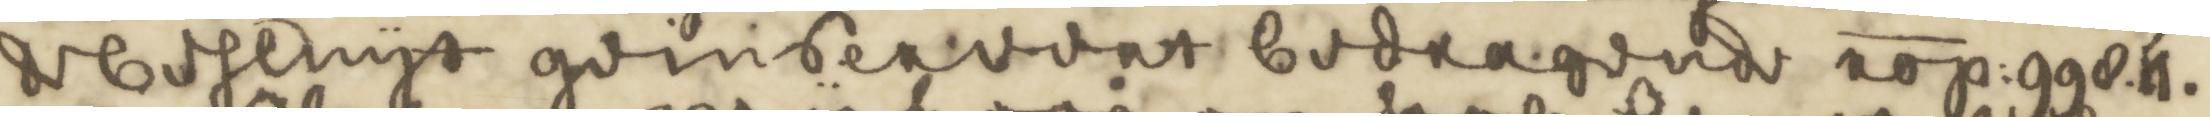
de besluijt geinsereert bedragende rop: 998.11.
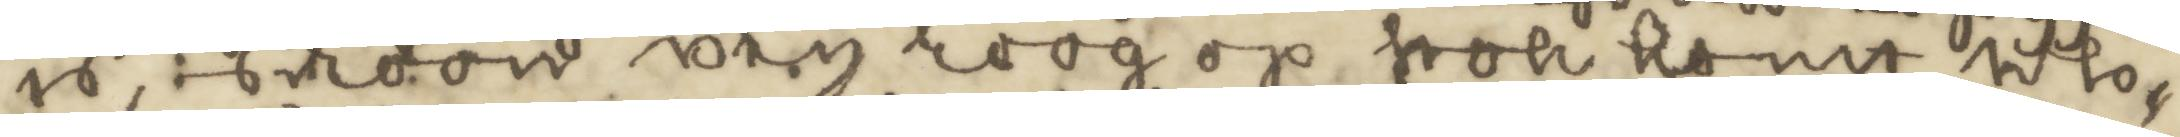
is, schoon vrij hoog op stok komt te lo„
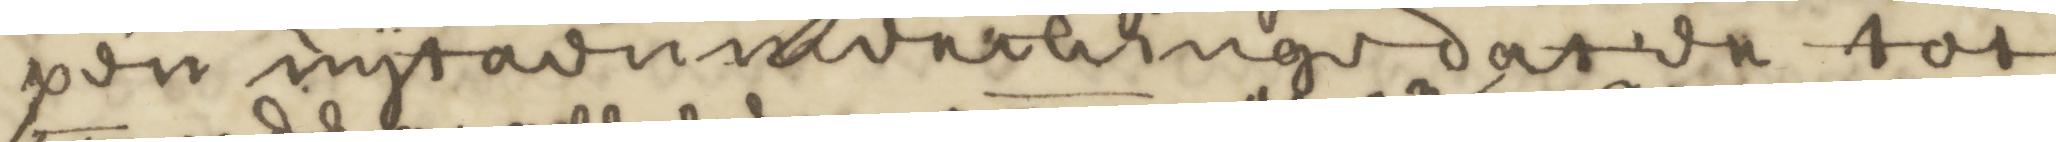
pen uijt aenmerckinge dat'er tot
